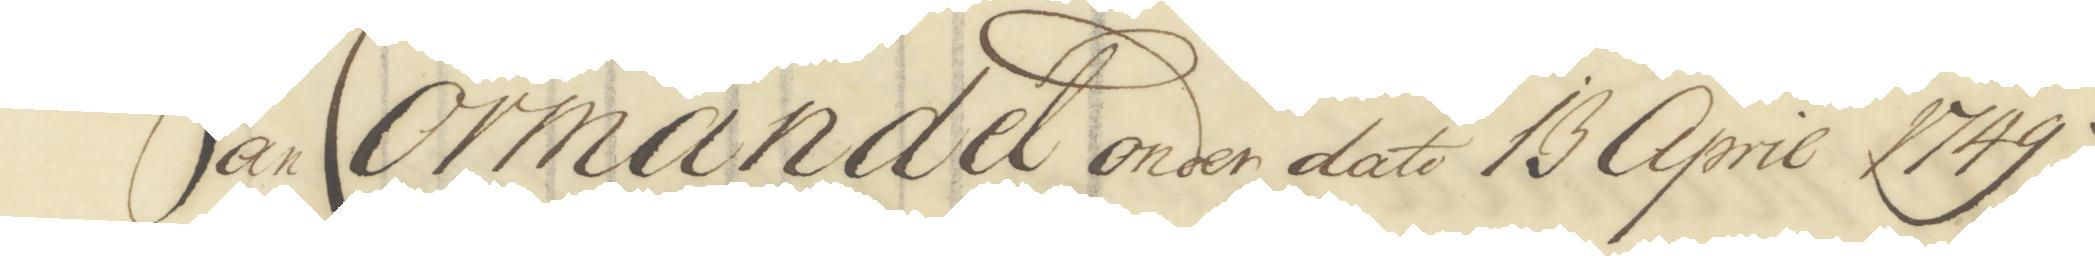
Van Cormandel onder dato 13 April 1749
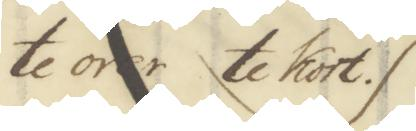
te over te kort.
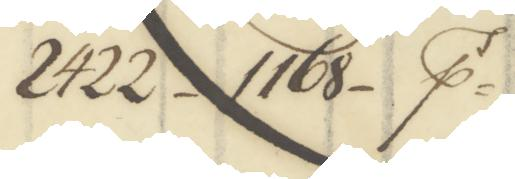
2422 — 1168 — p=s
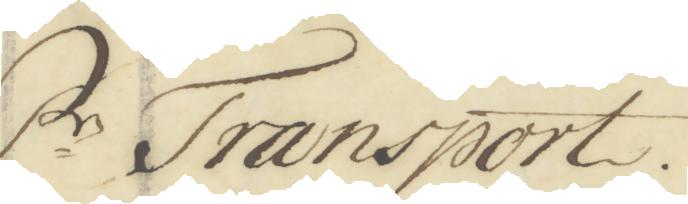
P=r Transport.
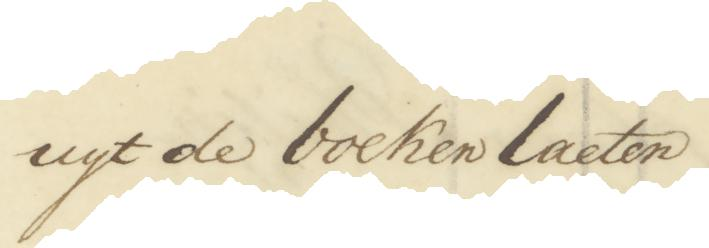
uyt de boeken laeten
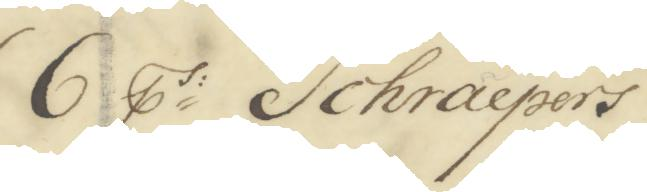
6 p=s: Schraepers
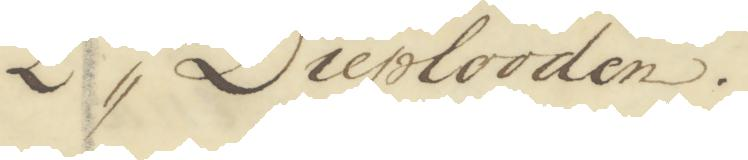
2 „ Dieplooden.
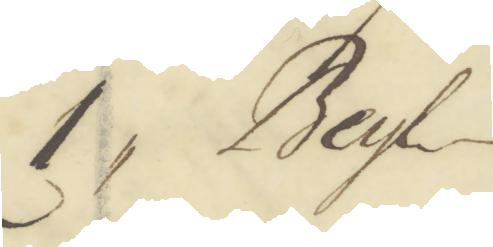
1 „ Beijl
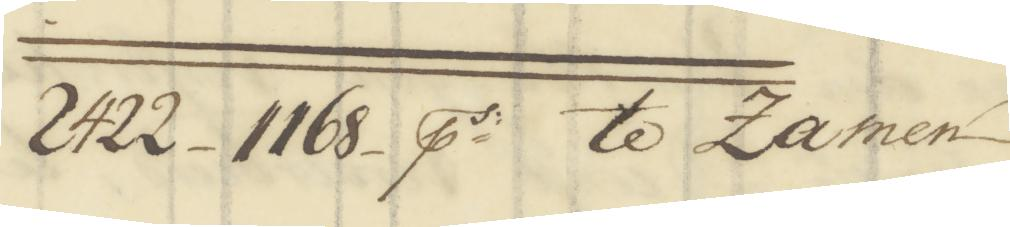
2422 _ 1168 _ p=s: te zamen
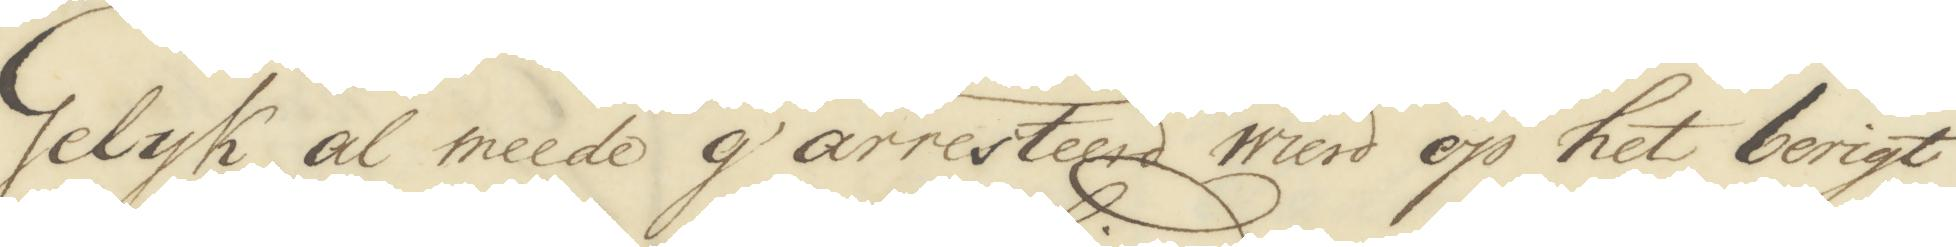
Gelijk al meede g’arresteerd wierd op het berigt
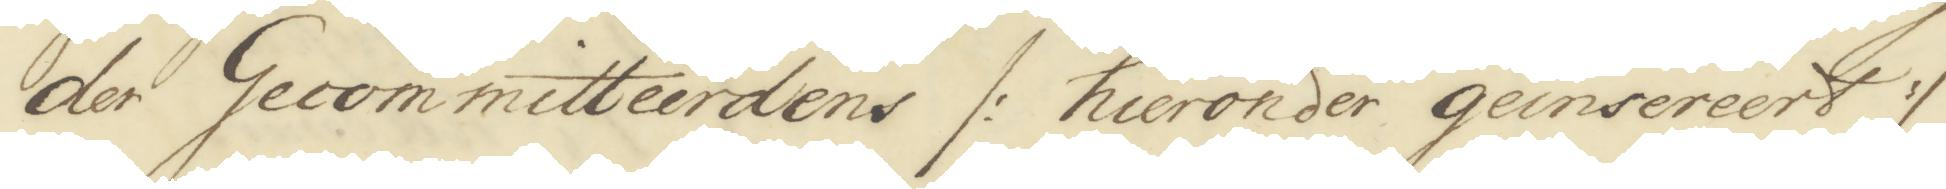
der Gecommitteerdens /: hieronder geinsereert :/
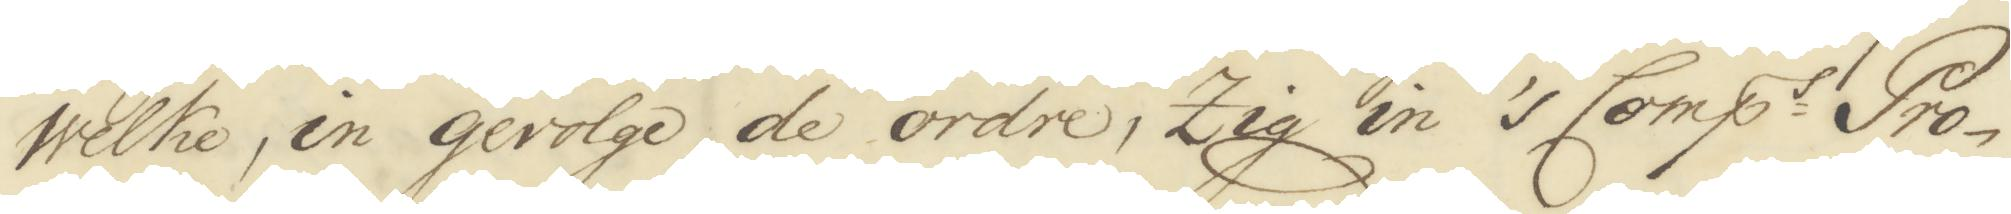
welke, in gevolge de ordre, zig in ’s Comp=s Pro=
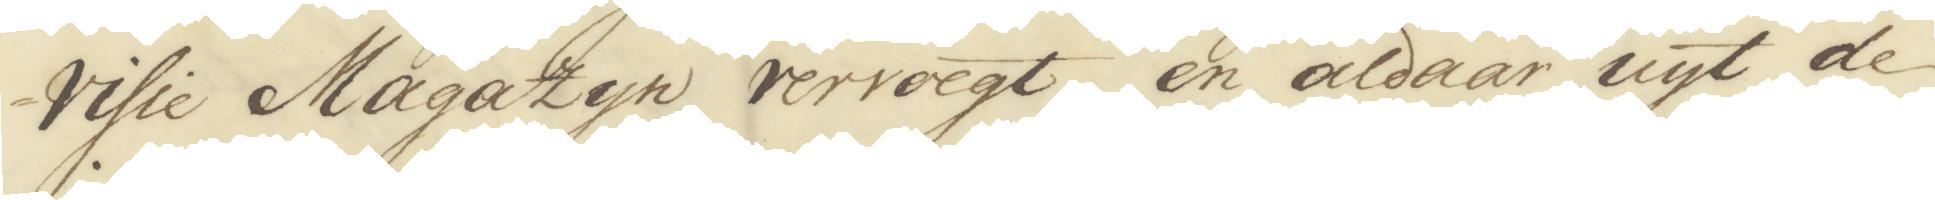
=visie Magazyn vervoegt, en aldaar uijt de
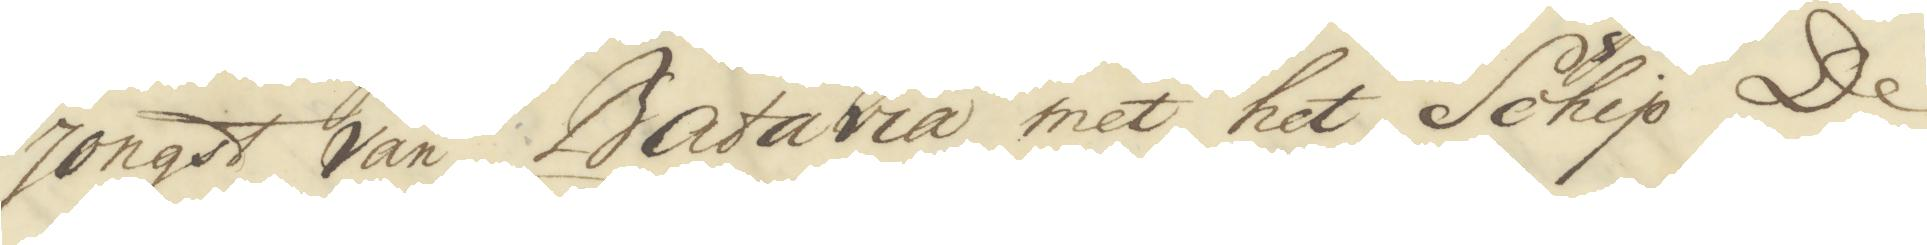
Jongst van Batavia met het Schip De
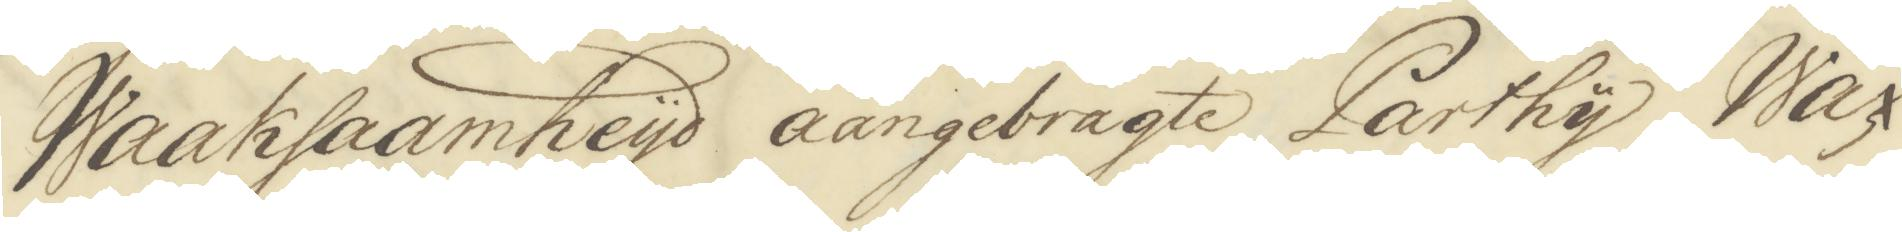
Waaksaamheijd aangebragte Parthij Wax
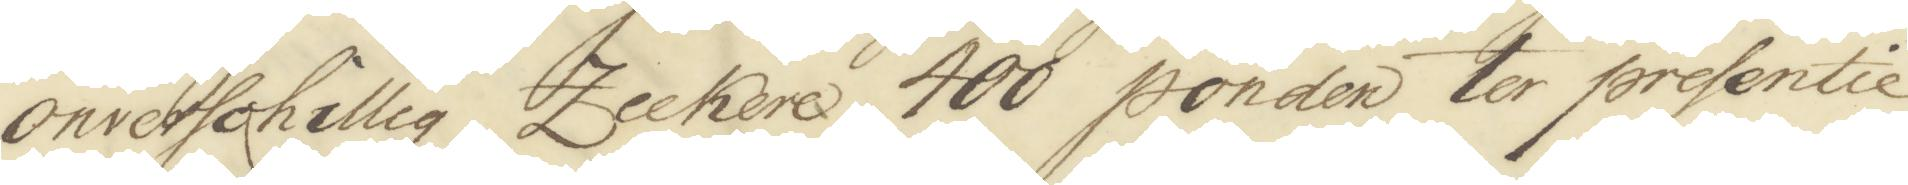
onverschillig Zeekere 400 ponden ter presentie
